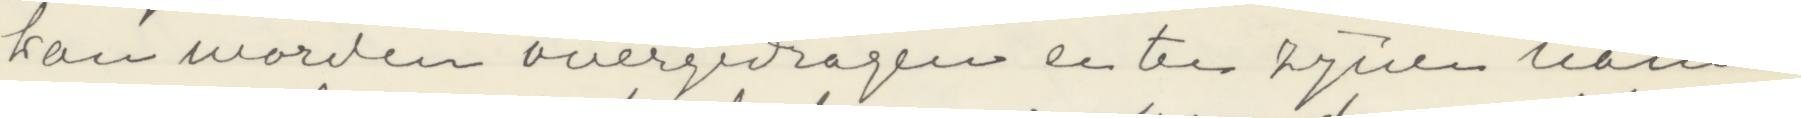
kan worden overgedragen en ten zijnen name
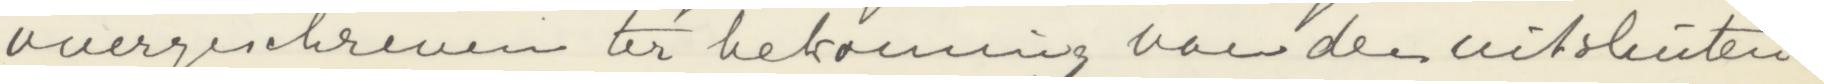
overgeschreven ter bekooming van den uitsluiten-
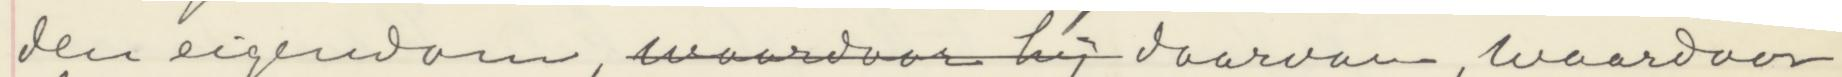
den eigendom, waardoor hij daarvan, waardoor
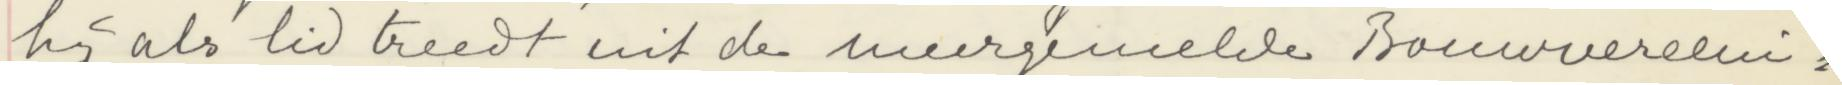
hij als lid treedt uit de meergemelde Bouwvereeni=
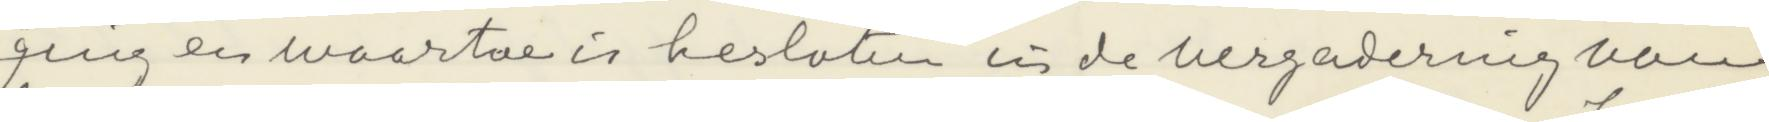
ging en waartoe is besloten in de vergadering van
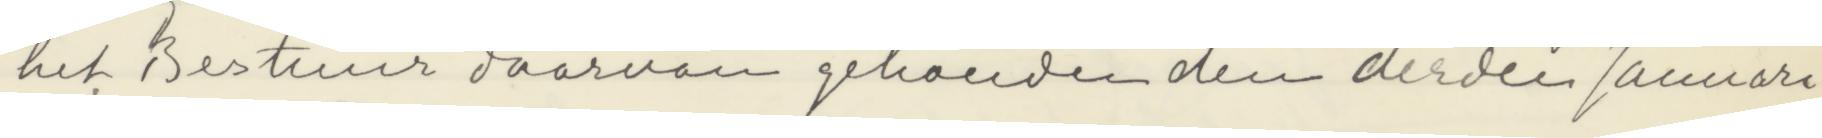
het Bestuur daarvan gehouden den derden Januari
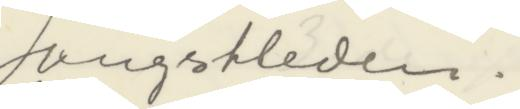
jangstleden.
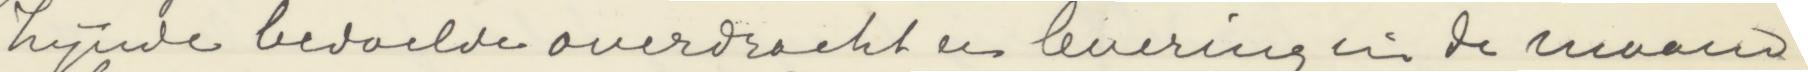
Zijnde bedoelde overdracht en levering in de maand
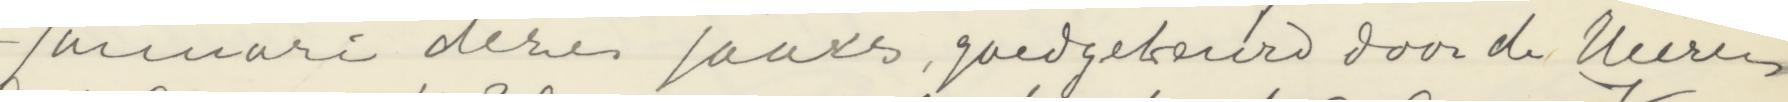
Januari dezes jaars, goedgekeurd door de Heeren
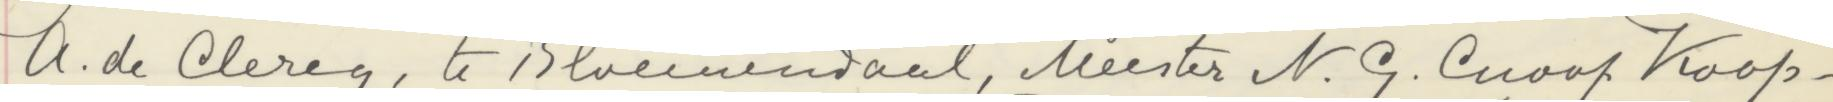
A. de Clercq, te Bloeemendaal, Meester N. G. Cnoop Koop-
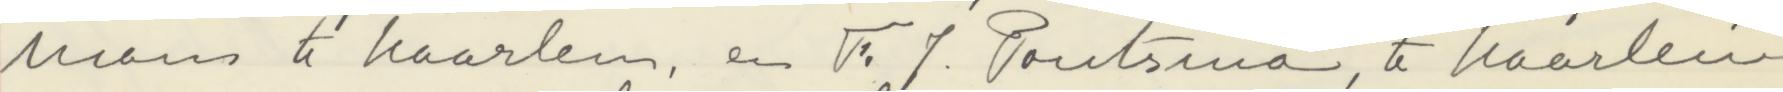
mans te Haarlem, en F. J. Pontsma, te Haarlem
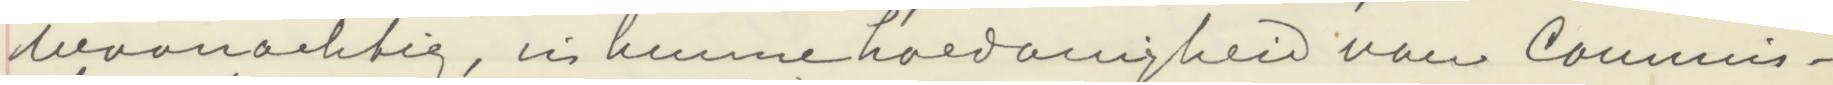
woonachtig, in hunne hoedanigheid van Commis-
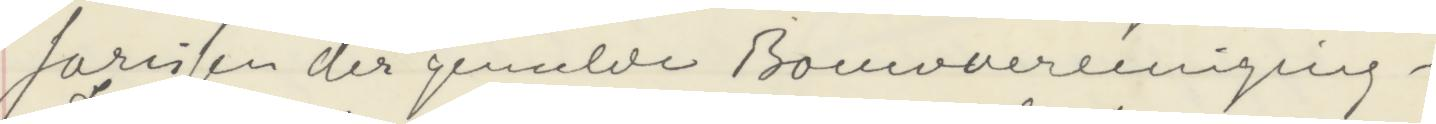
sarissen der gemelde Bouwvereeniging
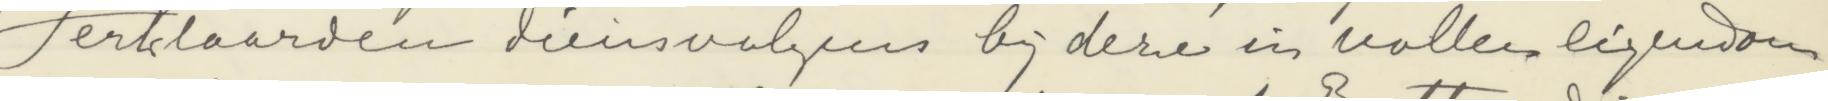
Verklaarden diensvolgens bij deze in vollen eigendom
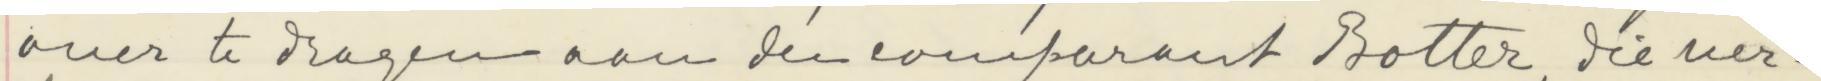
over te dragen aan den comparant Botter, die ver-
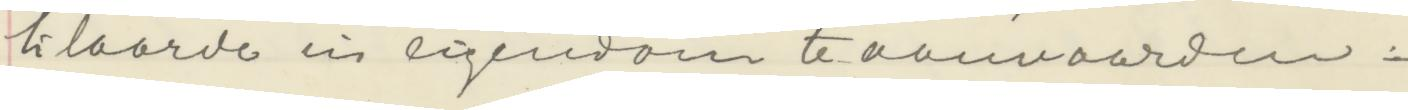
klaarde in eigendom te aanvaarden-
